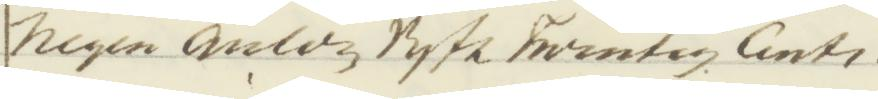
Negen gulden Vyf & Twintig Cents
